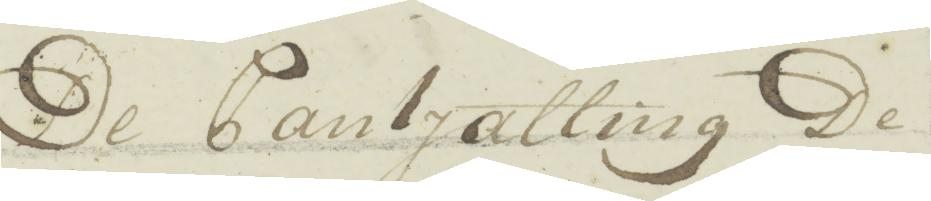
De Pantjalling De
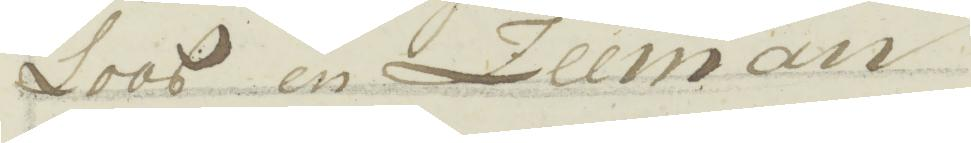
Loos en Zeeman
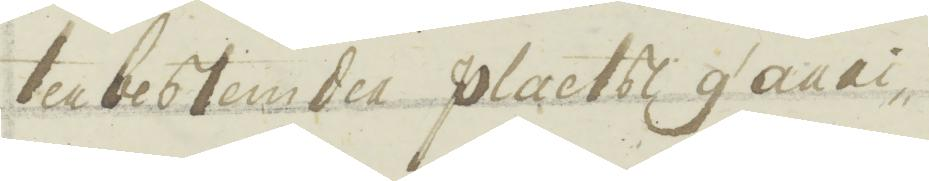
ter bestemder plaetse g’arri„
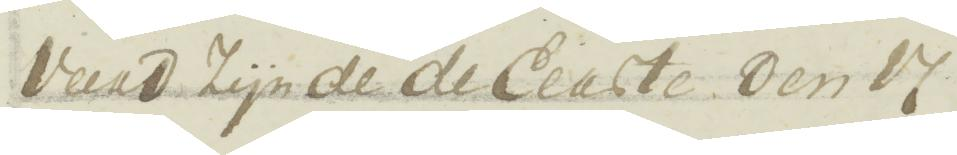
veerd zijnde de Eerste den 17
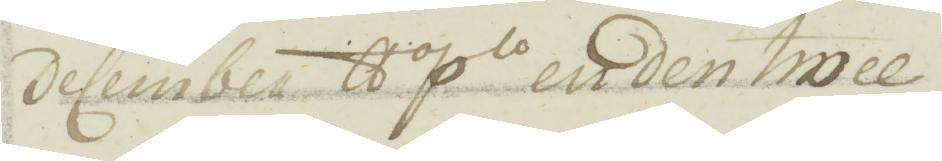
december A:o p=to en den twee
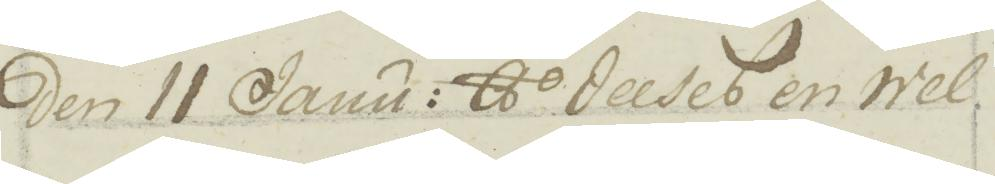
den 11 Janu: A:o deeses en wel
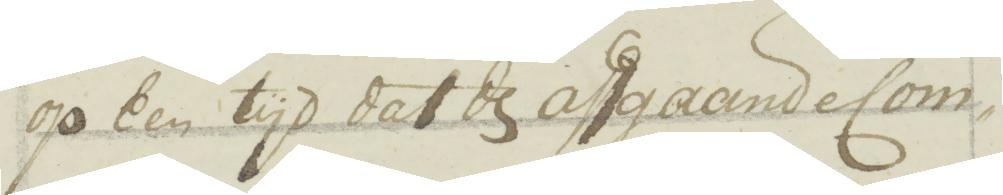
op Een tijd dat den affgaande Com„
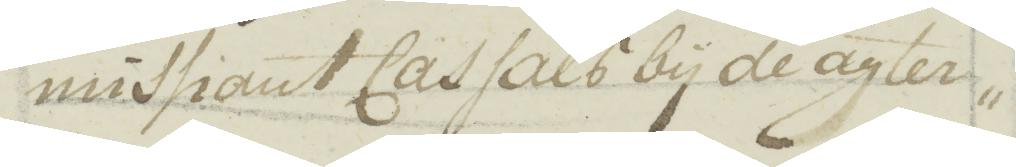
missiant Cassals bij de agter„
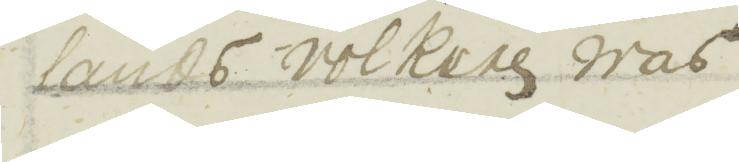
lands volkeren was
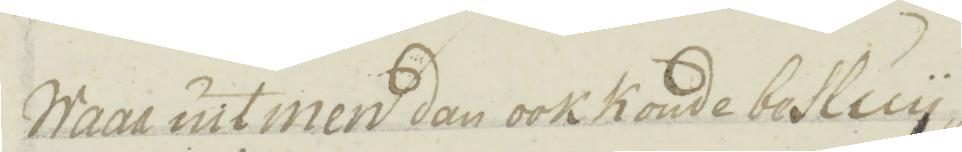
waar uit men dan ook konde besluij„
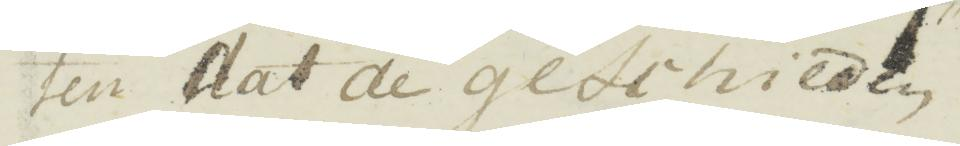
ten dat de geschieden
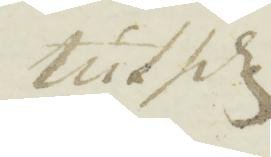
tussen
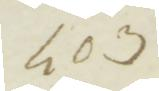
403
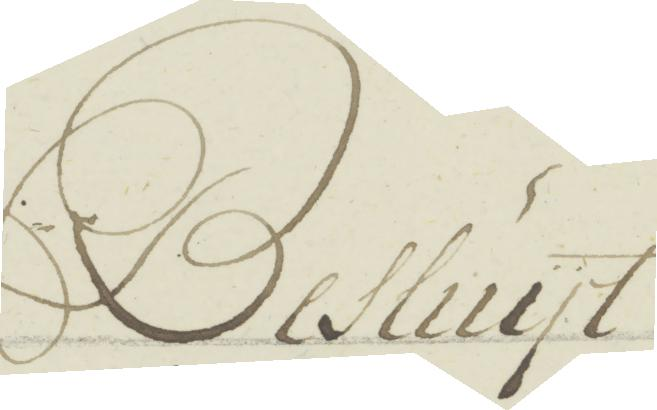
Besluijt
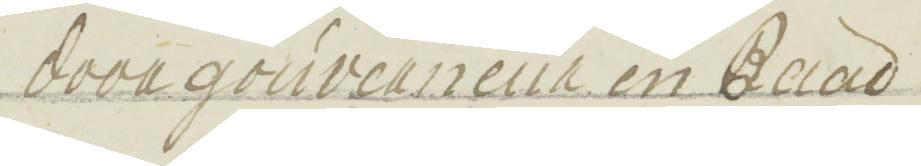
door gouverneur en Raad
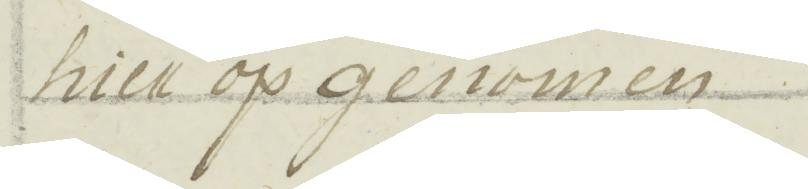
hier op genomen
